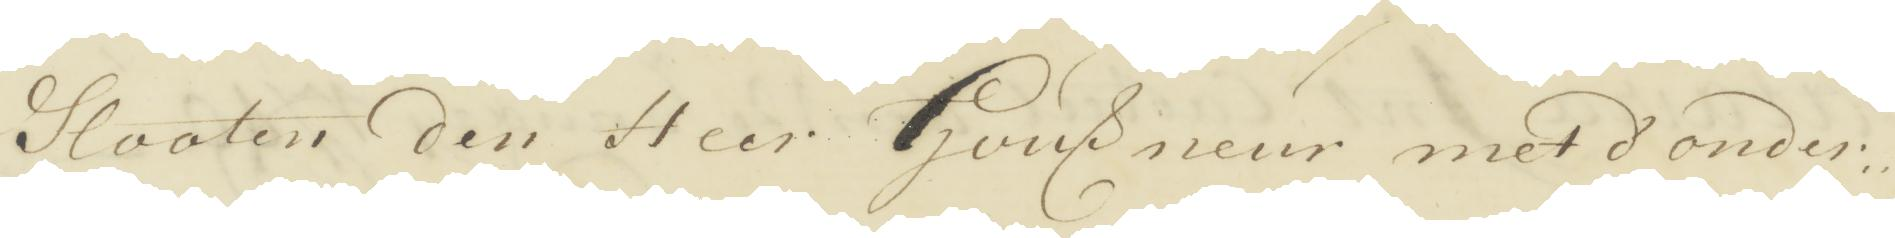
Slooten den Heer Gouverneur met d’onder„
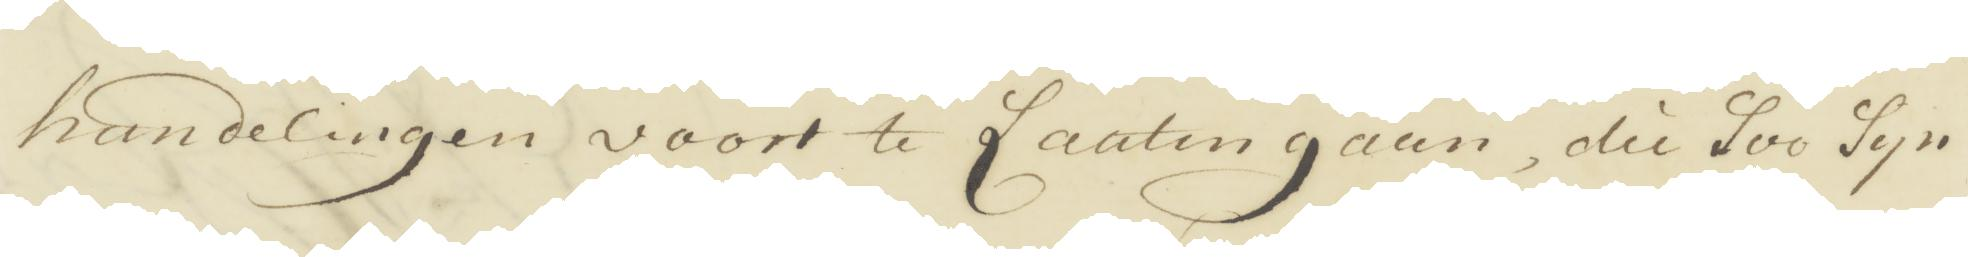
handelingen voort te Laaten gaan, die Soo Syn
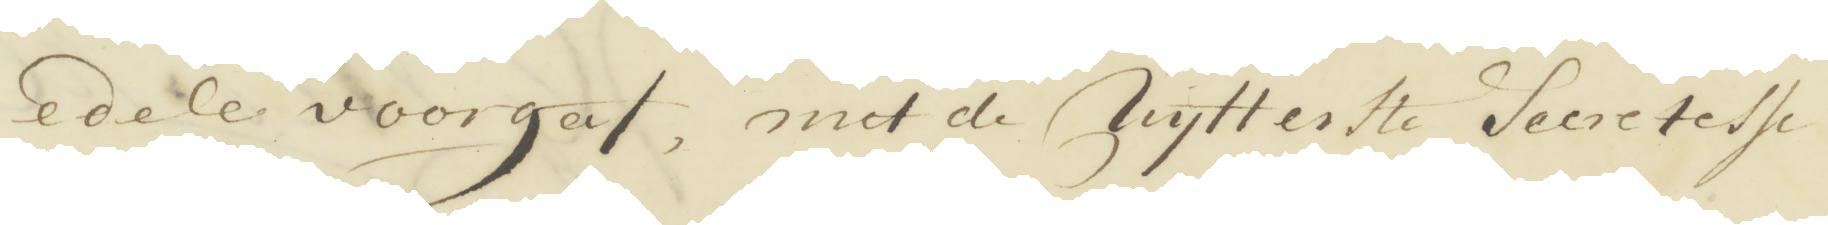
edele voorgaf, met de uytterste Secretesse
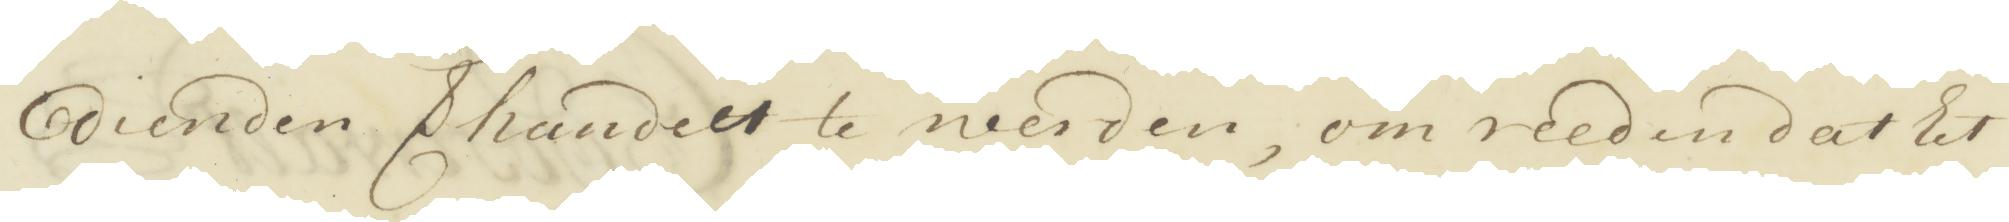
dienden verhandelt te werden, om reeden dat het
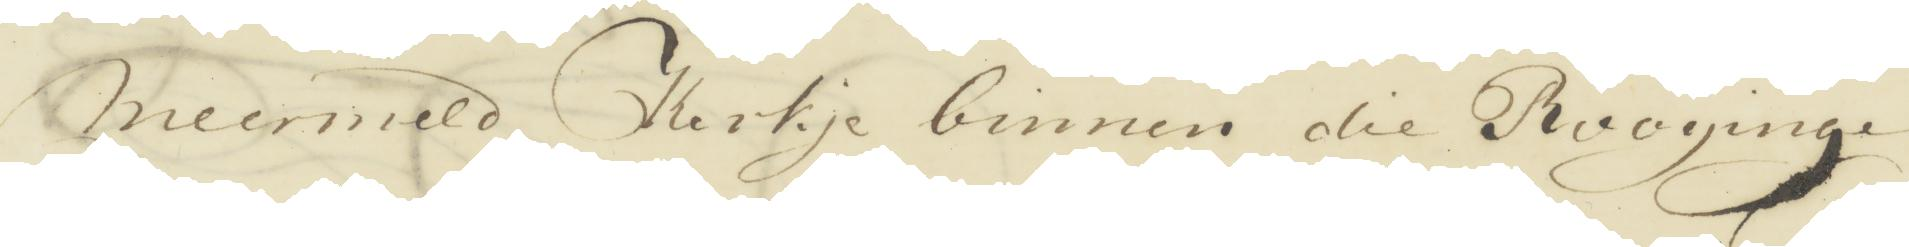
meermeld Kerkje binnen die Rooijinge
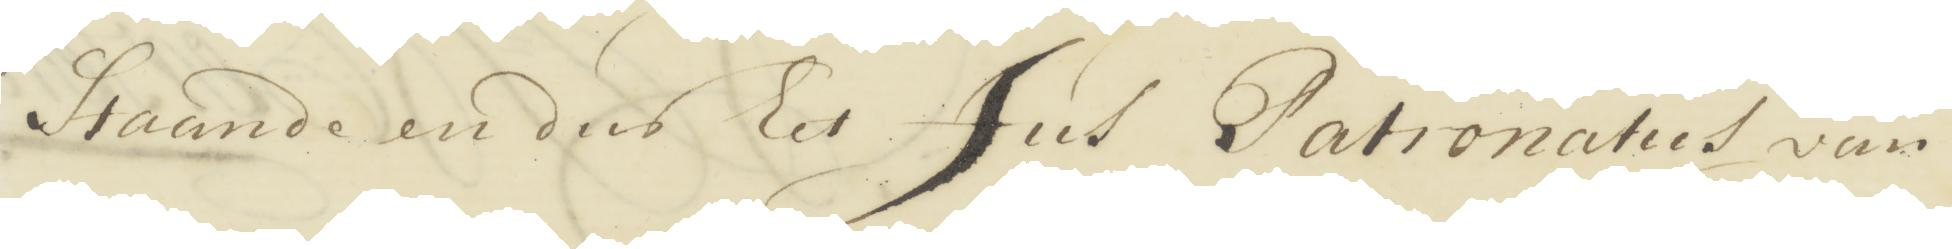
Staande en dus het Jus Patronatus van
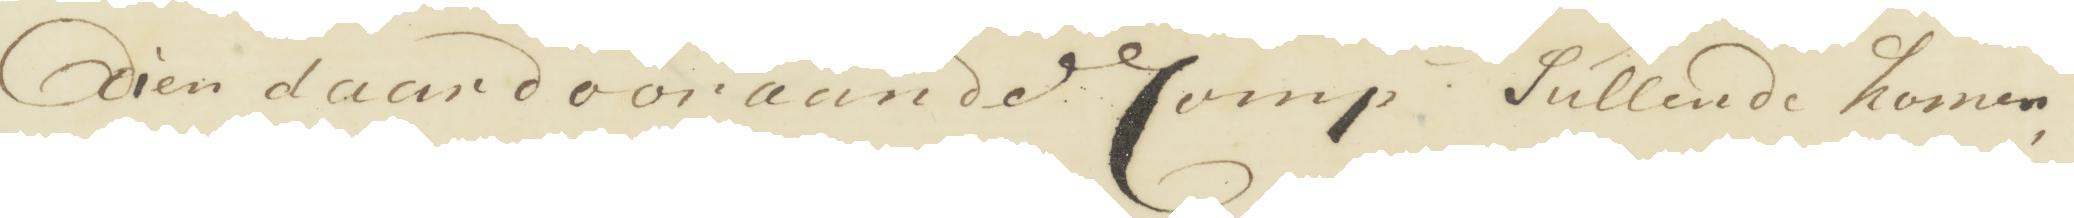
dien daar door aan d E:e Comp:e sullende komen,
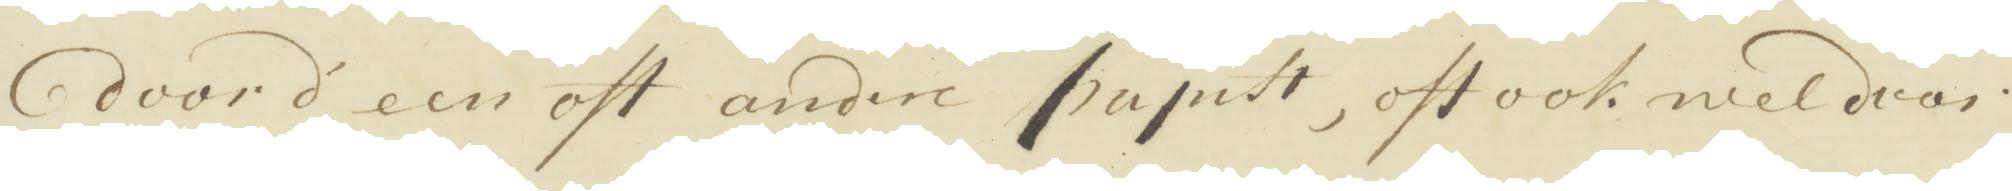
door d’ een oft andere papist, oft ook wel door
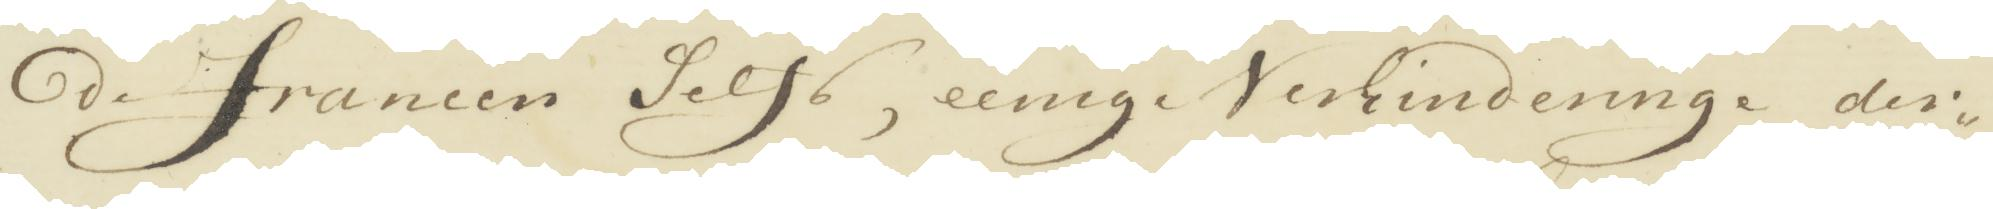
de Francen Selfs, eenige Verhinderinge der„
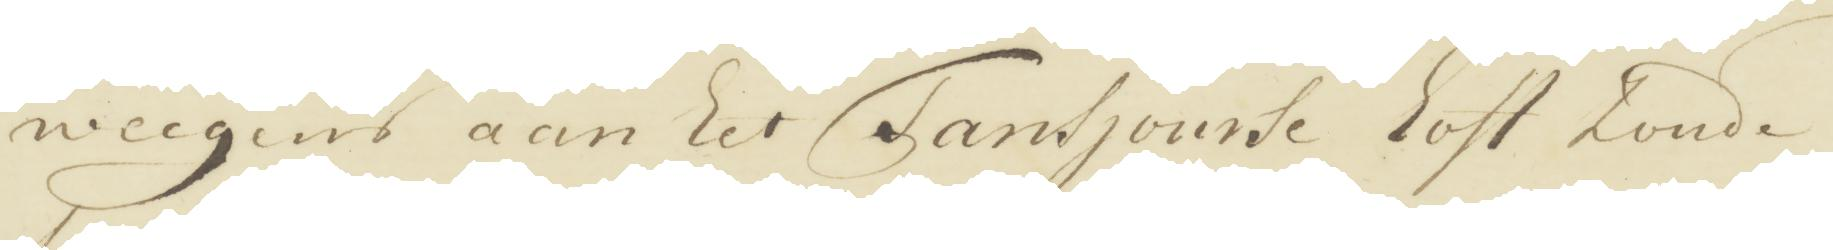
weegens aan het Tansjourse hoff Zoude
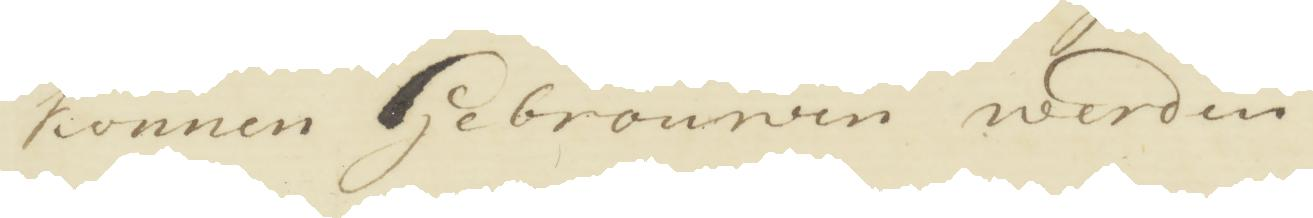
konnen Gebrouwen werden.
